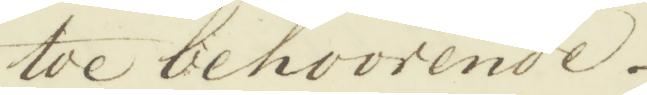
toe behoorende.
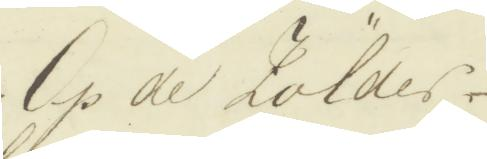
Op de Zolder
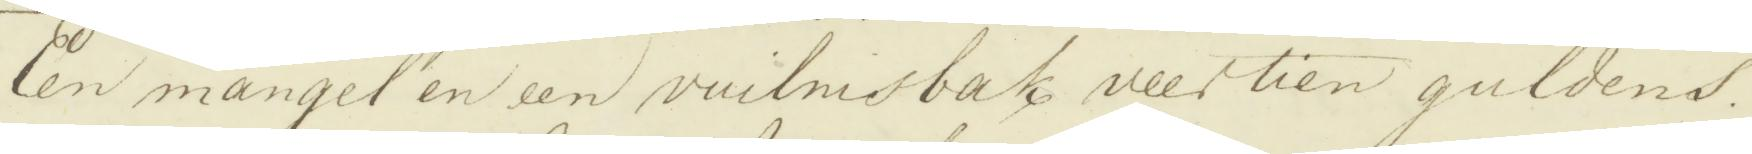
Een mangel en een vuilnisbak veertien guldens.
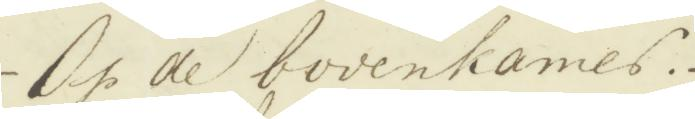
Op de bovenkamer.
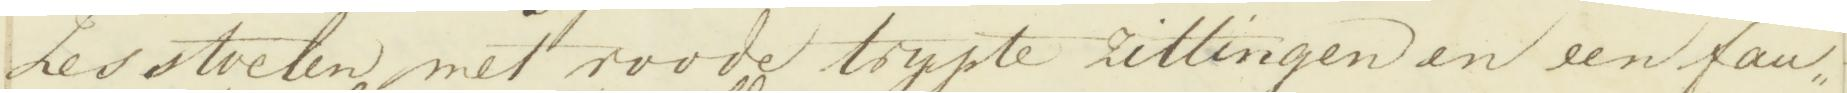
Zes stoelen met roode trijpte zittingen en een fau„
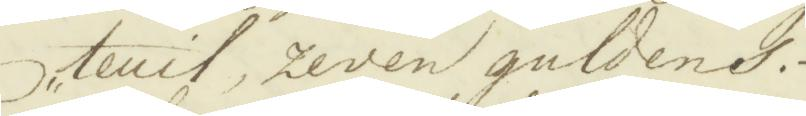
„teuil, zeven guldens.
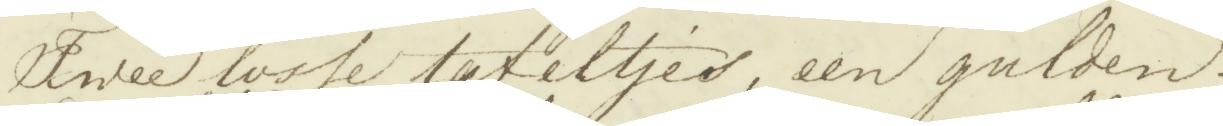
Twee losse tateltjes, een gulden.
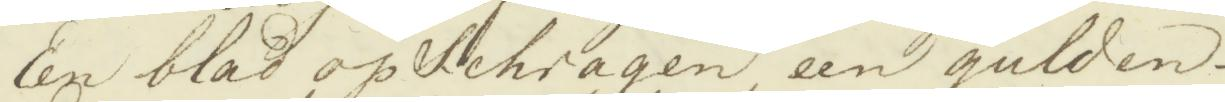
Een blad opschragen, een gulden.
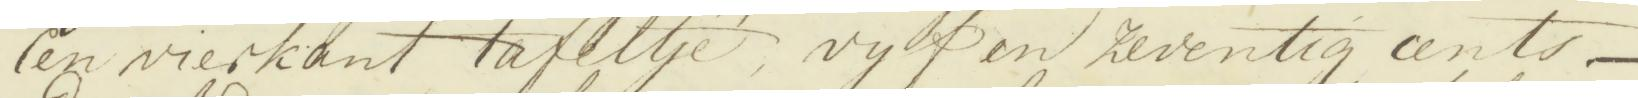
Een vierkant tateltje, vijf en zeventig cents —
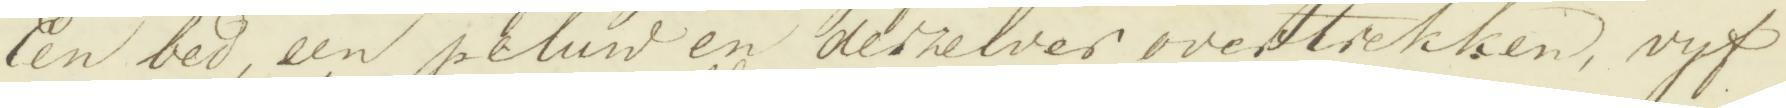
Een bed, een peluw en derzelver overtrekken, vyf
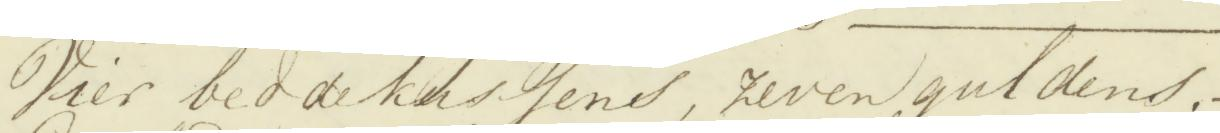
Vier beddekussens, zeven guldens.
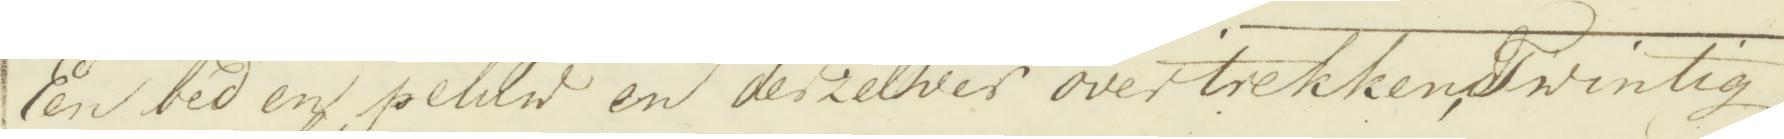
Een bed en peluw en derzelver overtrekken, Twintig
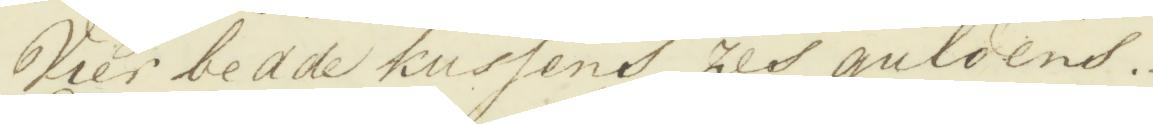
Vier bedde kussens, zes guldens.
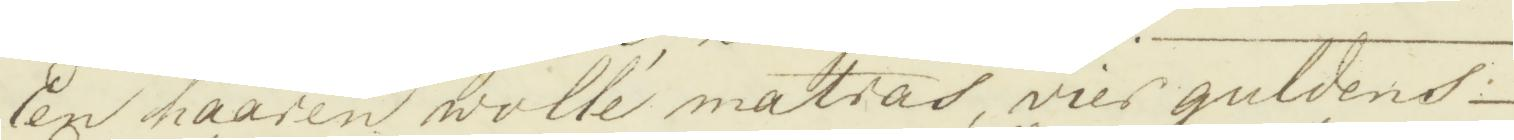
Een haaren wolle matras, vier guldens
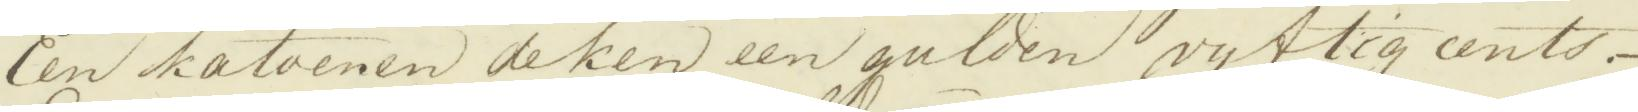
Een katoenen deken een gulden vijftig cents.
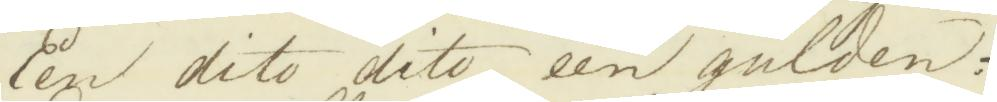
Een dito dito, een gulden.
